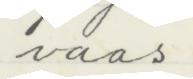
vaas
